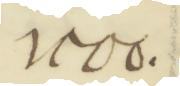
1500.
